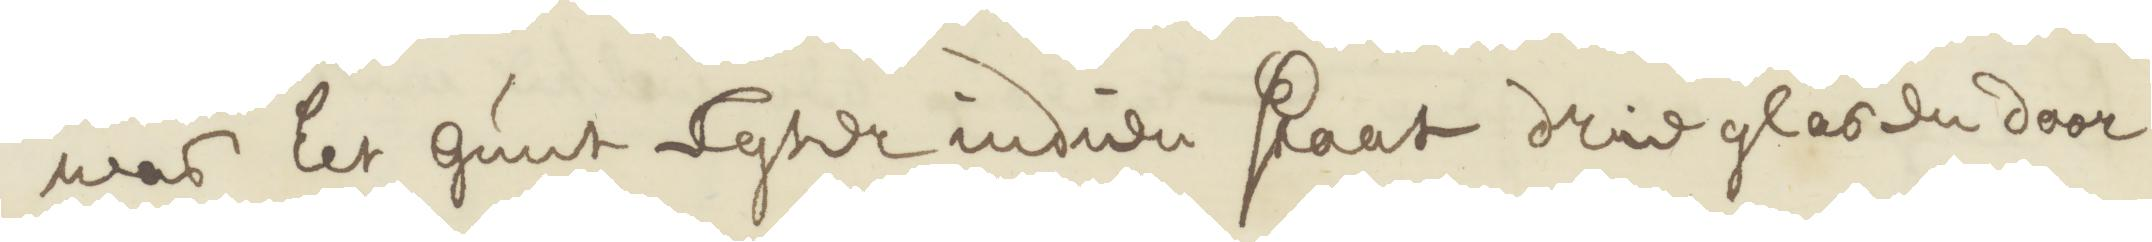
was het gunt Egter indien staat drie glasen door
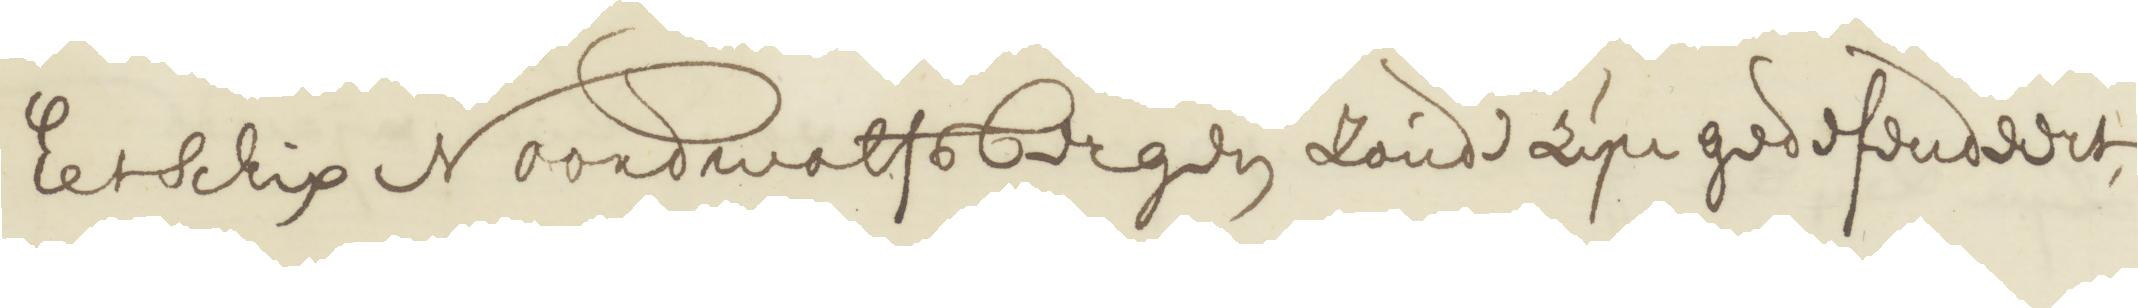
het schip Noordwolfsbergen zoude zijn gedesendeert,
